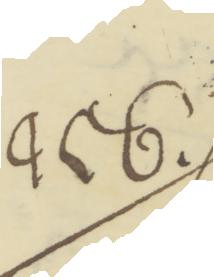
456.
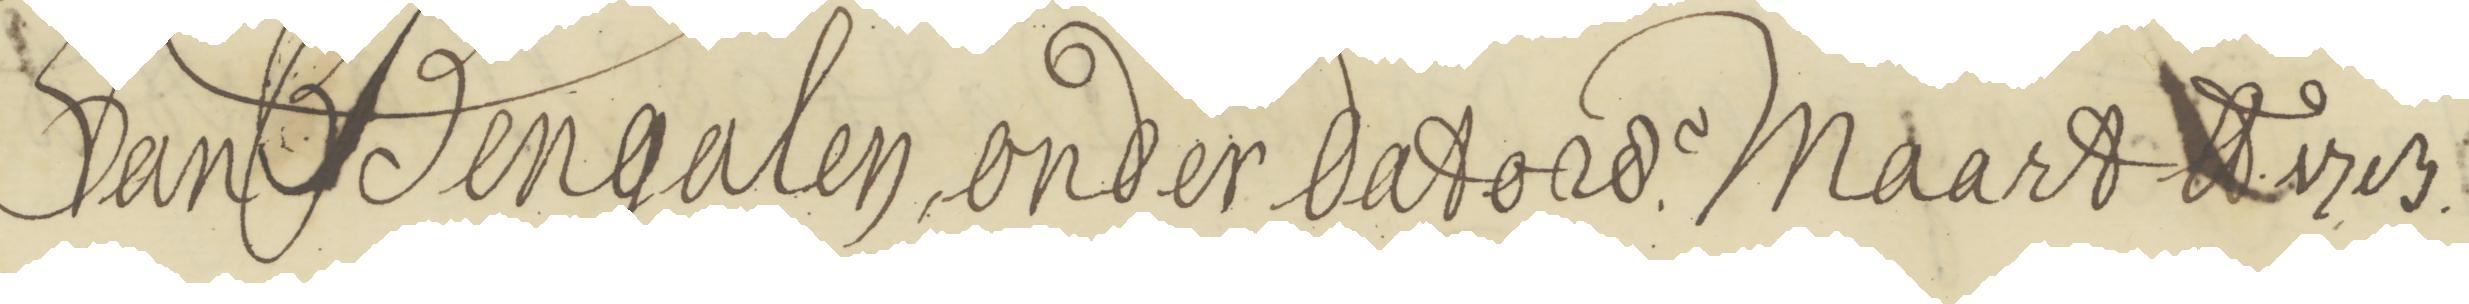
Van Bengalen, onder dato 28.' Maart A.o 1713.
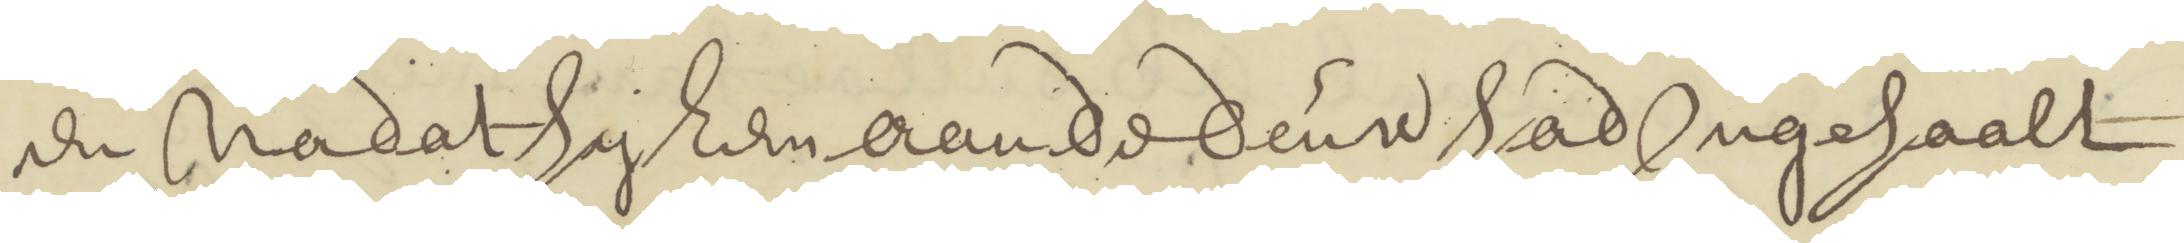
en nadat hij hem aan de deur had Jngehaalt
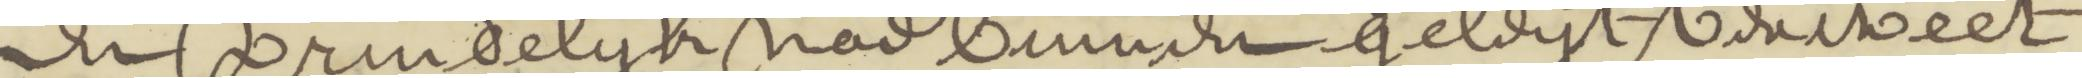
en vrindelijk nae binnen geleijt verweet
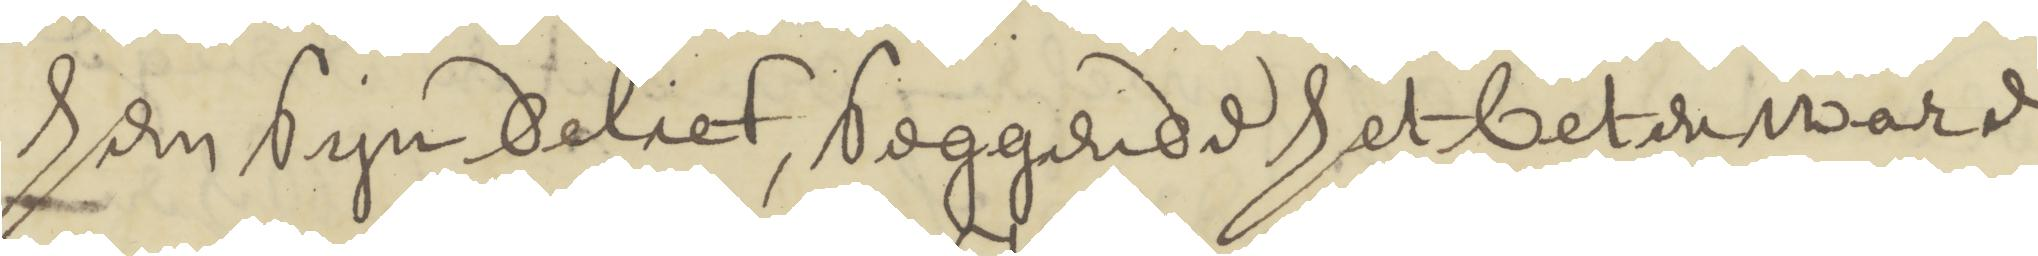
hem sijn deliet, seggende het beter ware
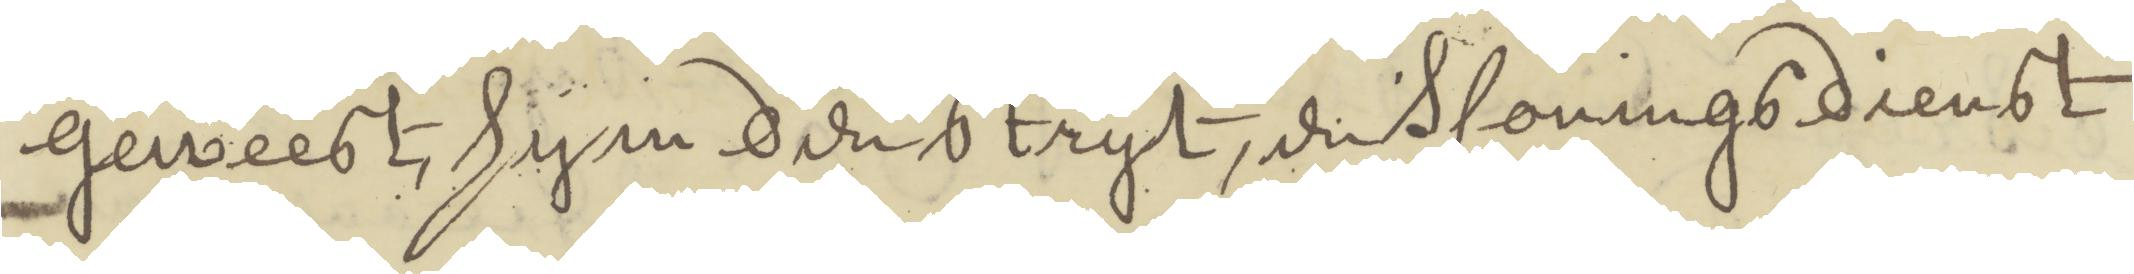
geweest, hij in den strijt, en 's Conings dienst
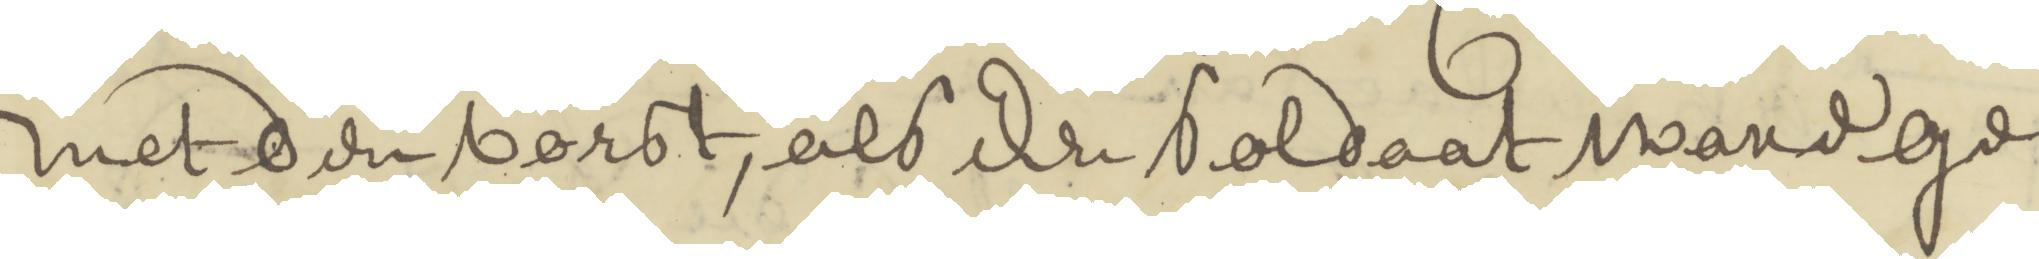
met den vorst, als Een soldaat ware ge
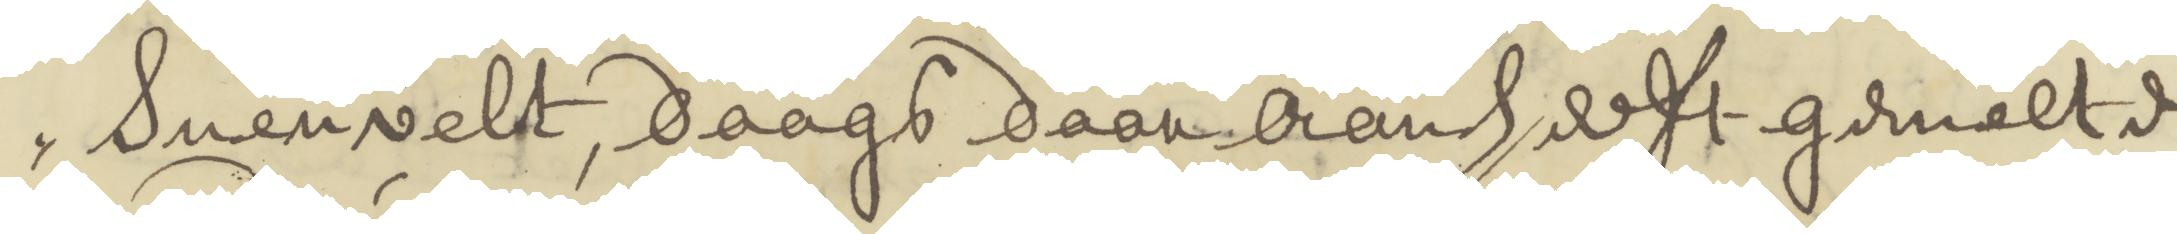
„sneuvelt, daags daar aan heeft gemelte
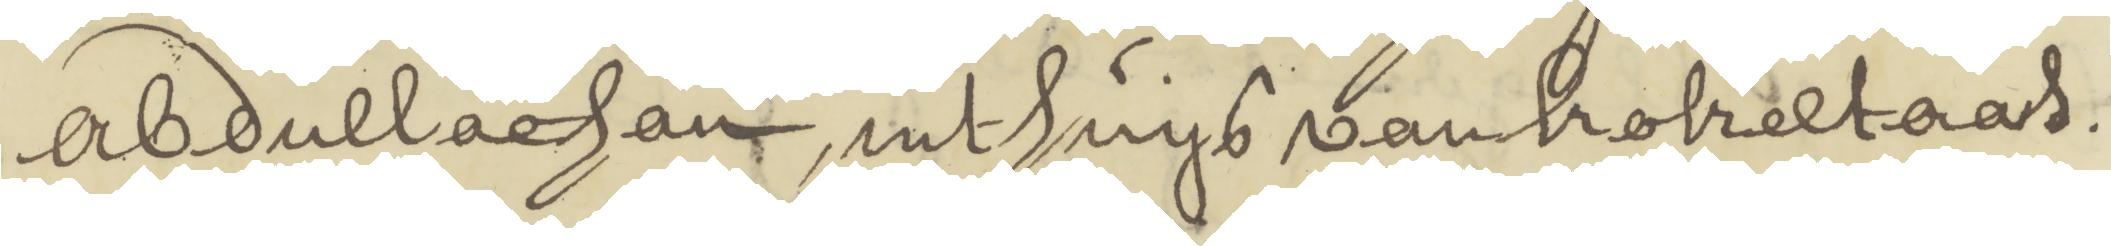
abdullachan, int huijs van kokeltaas„
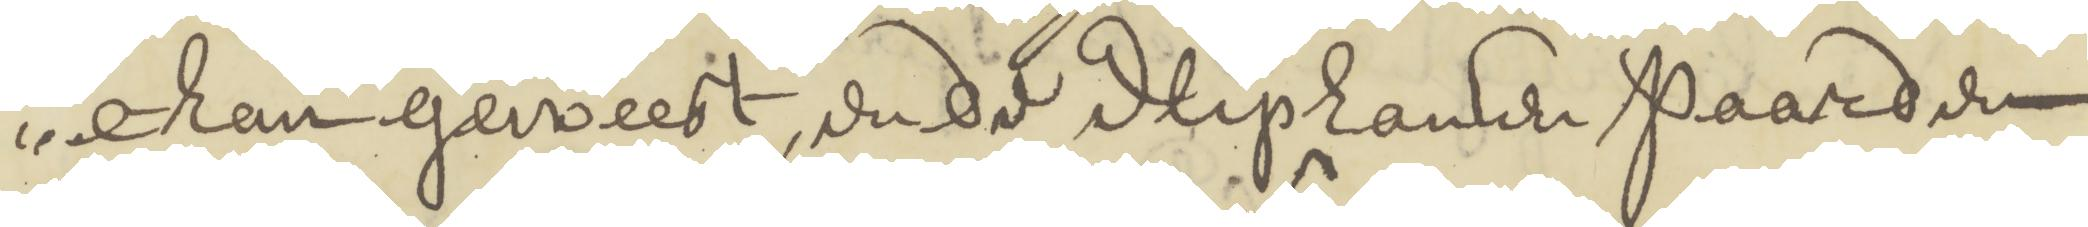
„chan geweest, en de Eliphanten Paarden
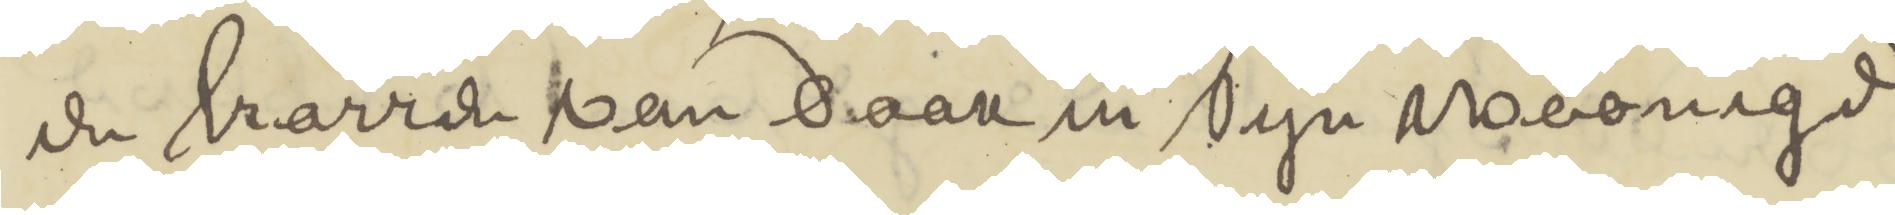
en karren van daar in sijn woonige
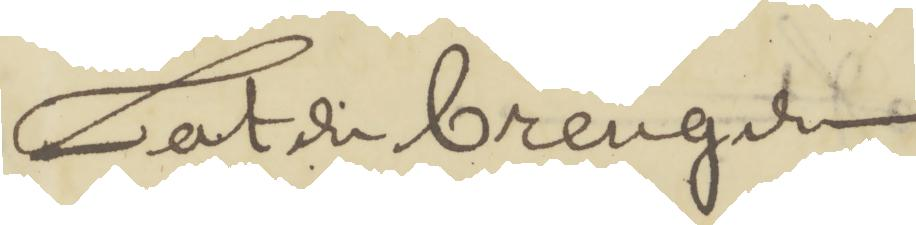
Laten brengen
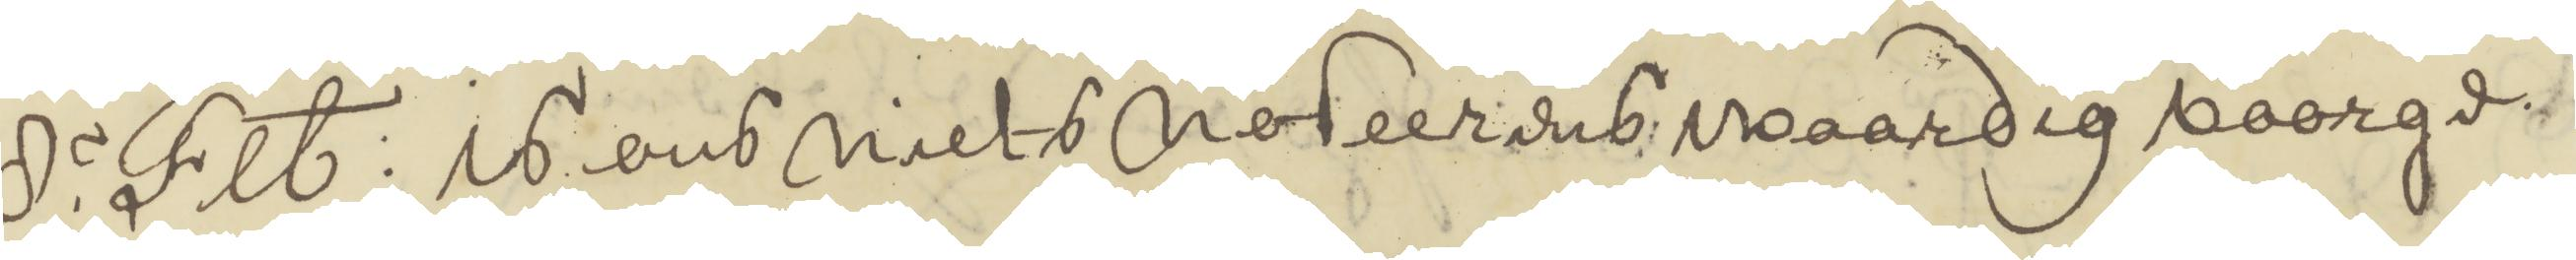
:' Feb: is ons niets noteerens waardig voorge„
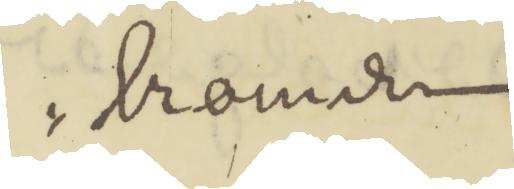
„komen
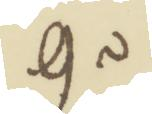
9.'
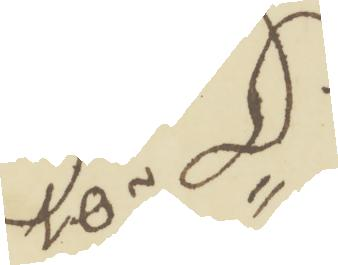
10.' D„o
